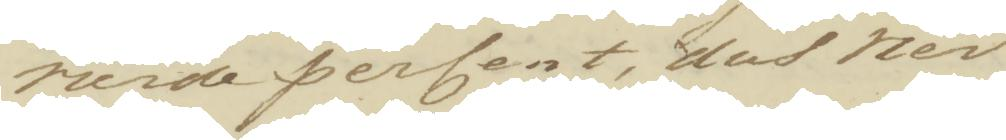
vierde percent, dus Vier
